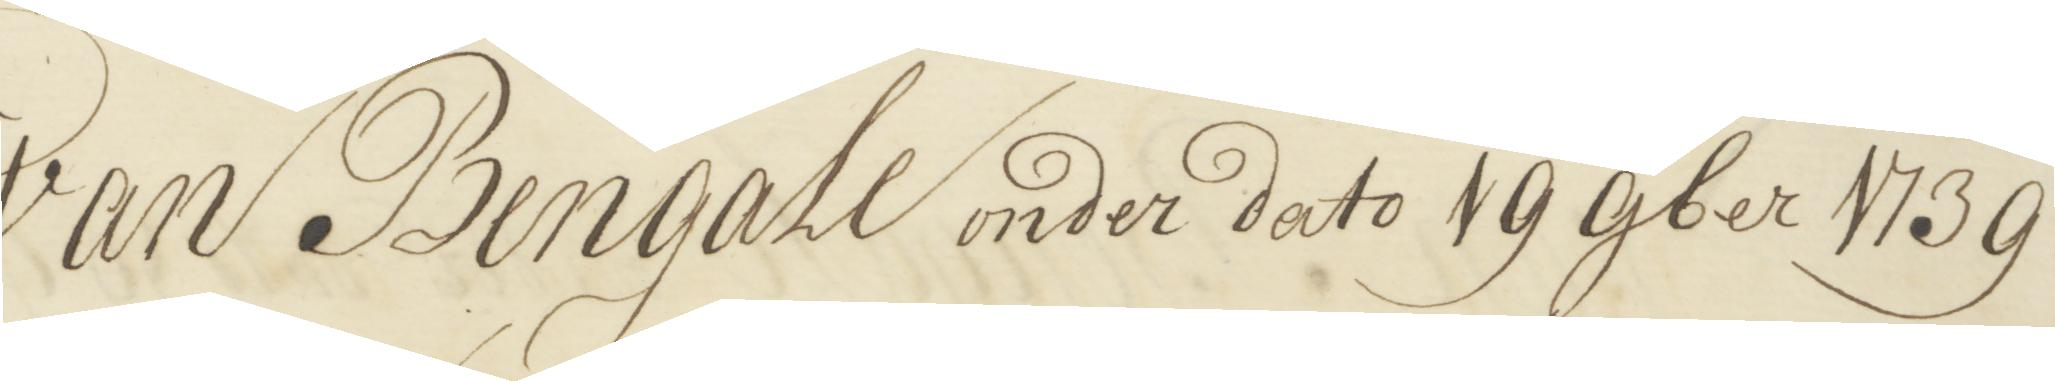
Van Bengale onder dato 19 9ber 1739
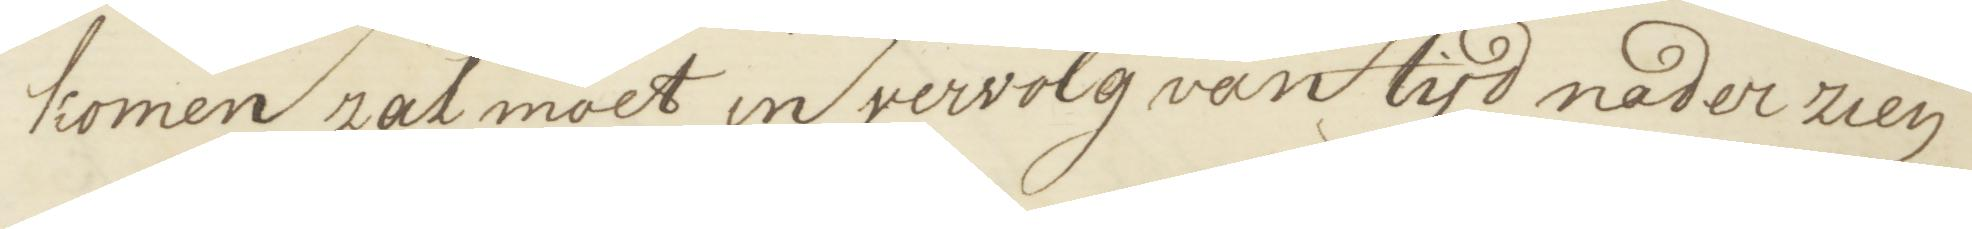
komen zal moet in vervolg van tijd nader zien
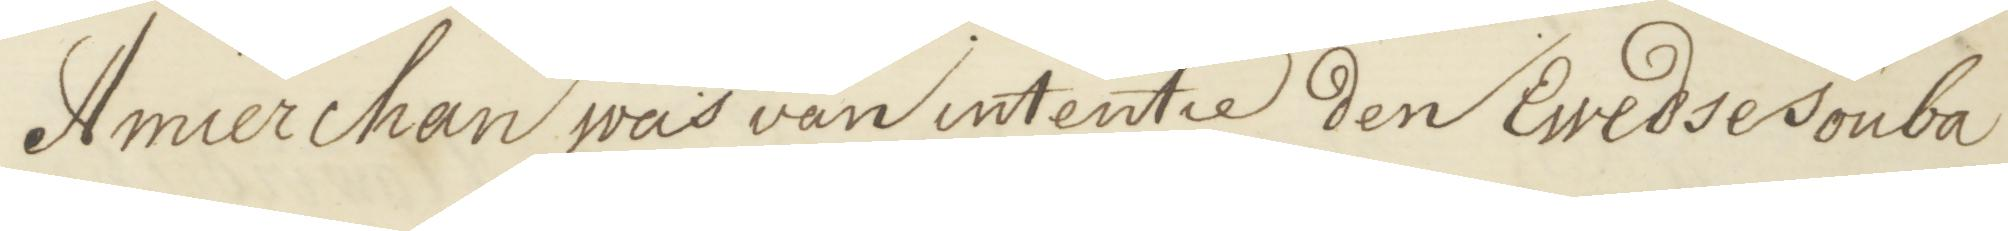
Amierchan was van intentie den Ewedse souba
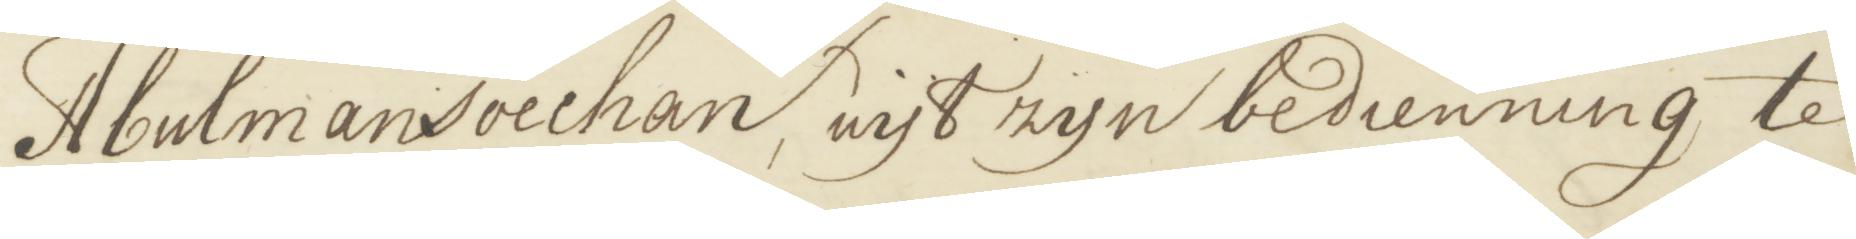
Abulmansoechan, uijt zijn bedienning te
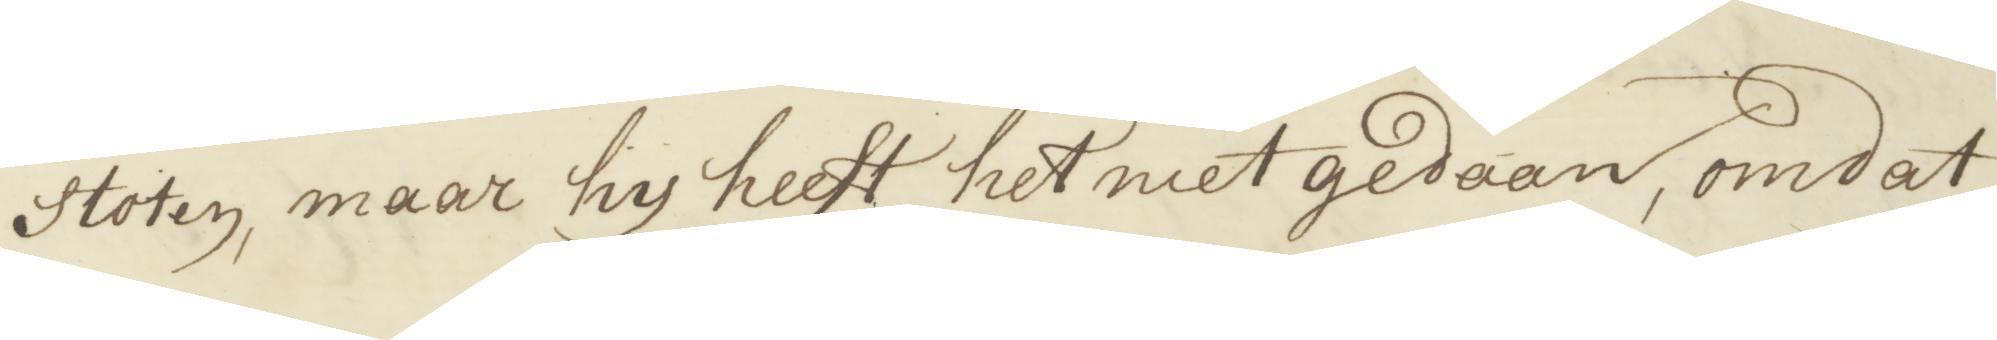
stoten, maar hij heeft het niet gedaan, omdat
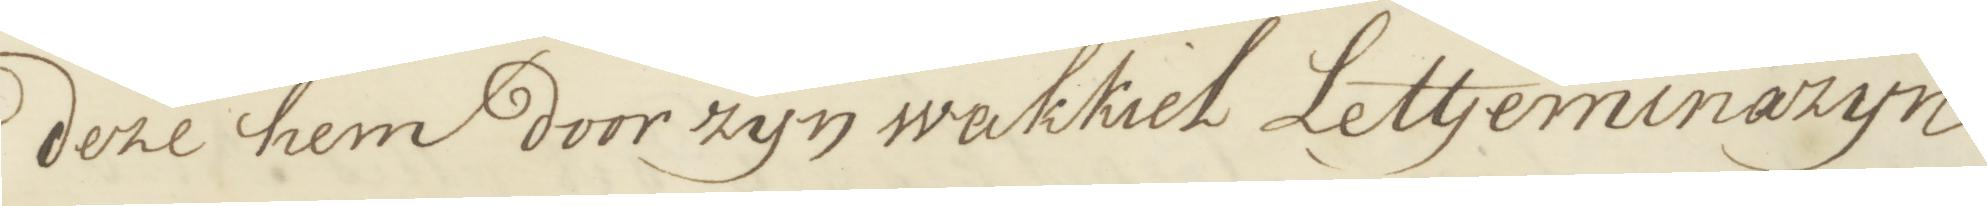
deze hem door zijn wakkiel Lettjeminazijn
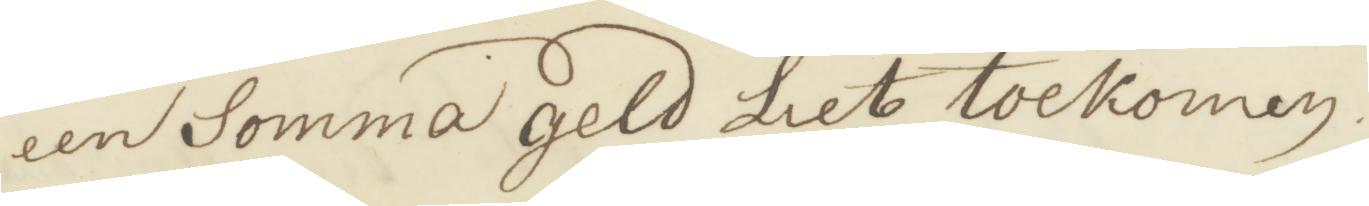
een somma geld liet toekomen.
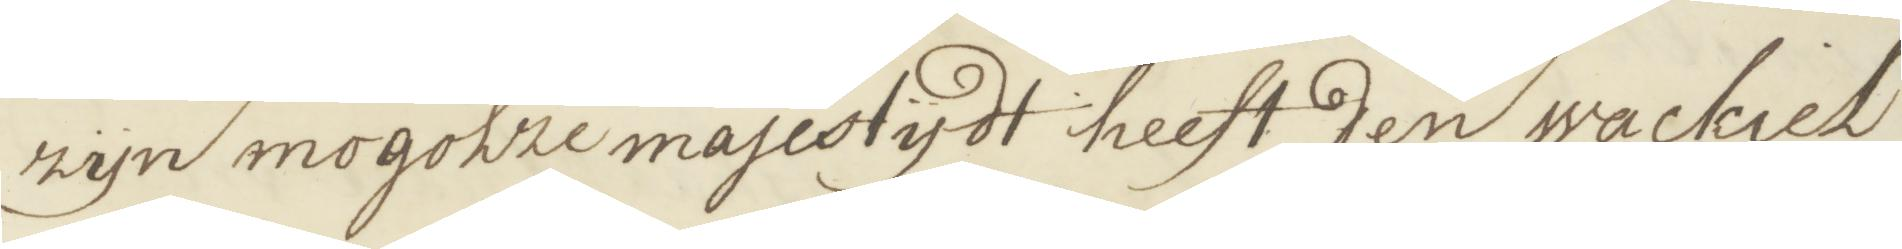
zijn mogolze majestijdt heeft den wackiel
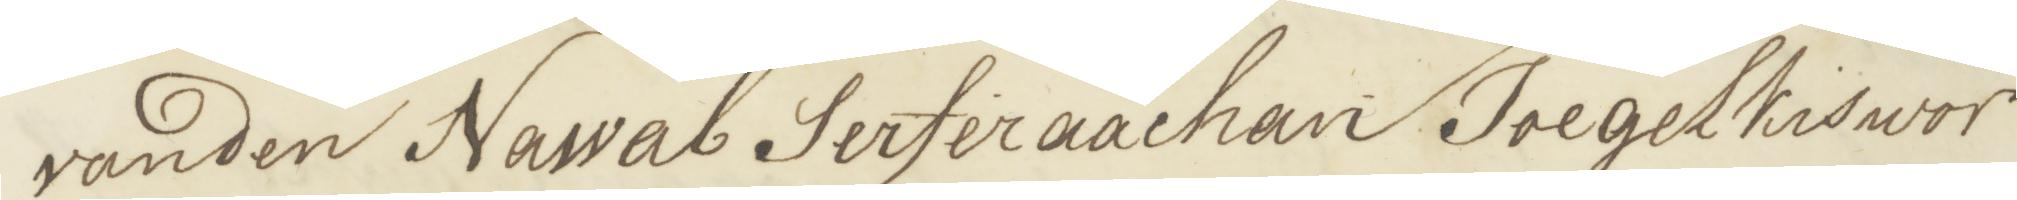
van den Nawal Serferaachan Ioegelkiswor
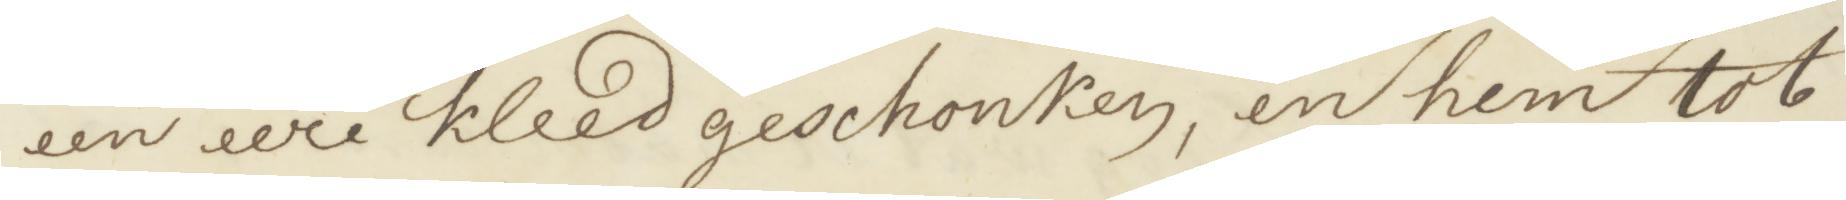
een eere kleed geschonken, en hem tot
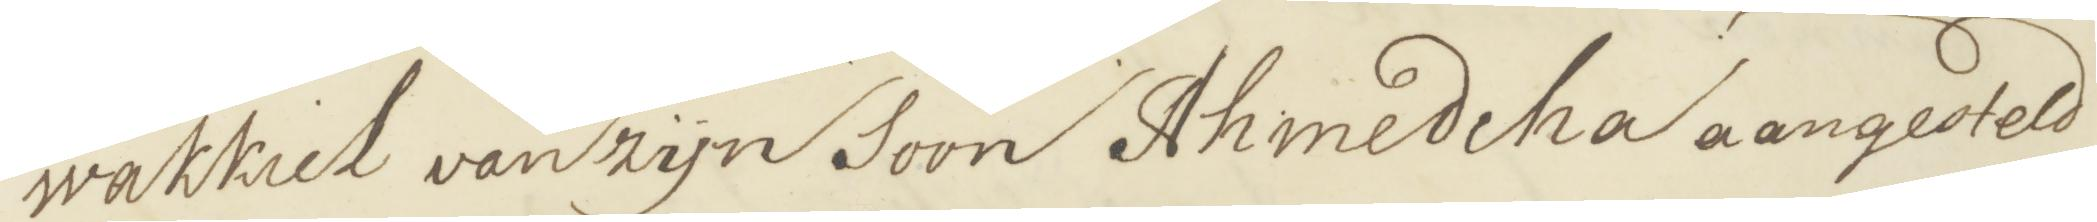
wakkiel van zijn soon Ahmedcha aangesteld
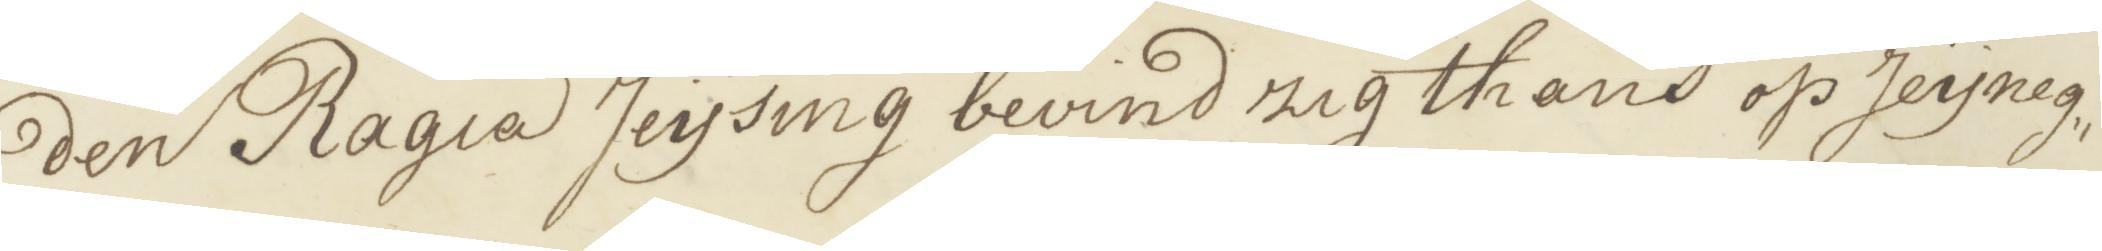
den Ragia Jeijsing bevind zig thans op Jeijneg„
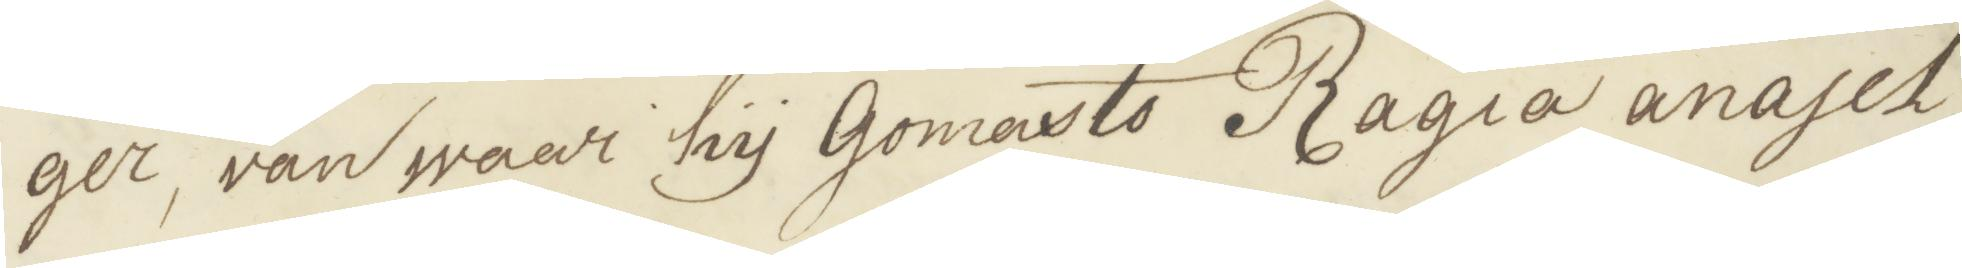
ger, van waar hij gomasts Ragia anajel
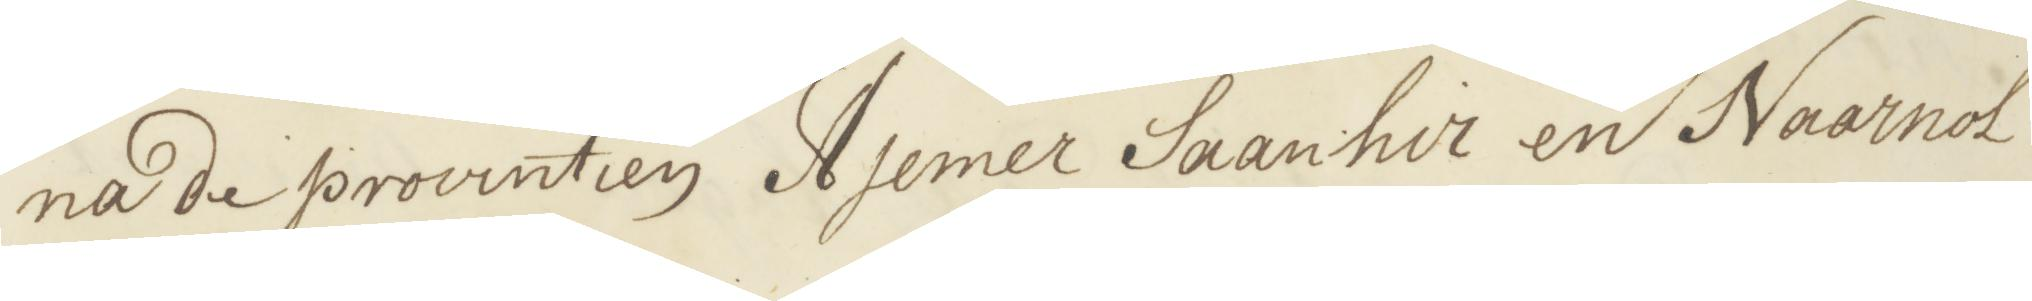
na de provintien Ajemer saanhir en Naarnol
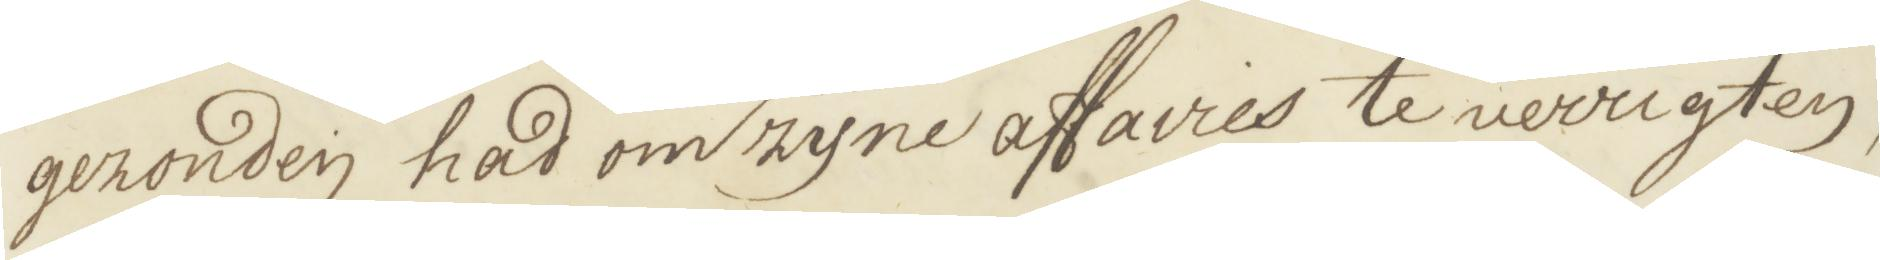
gezonden had om zijne affaires te verrigten,
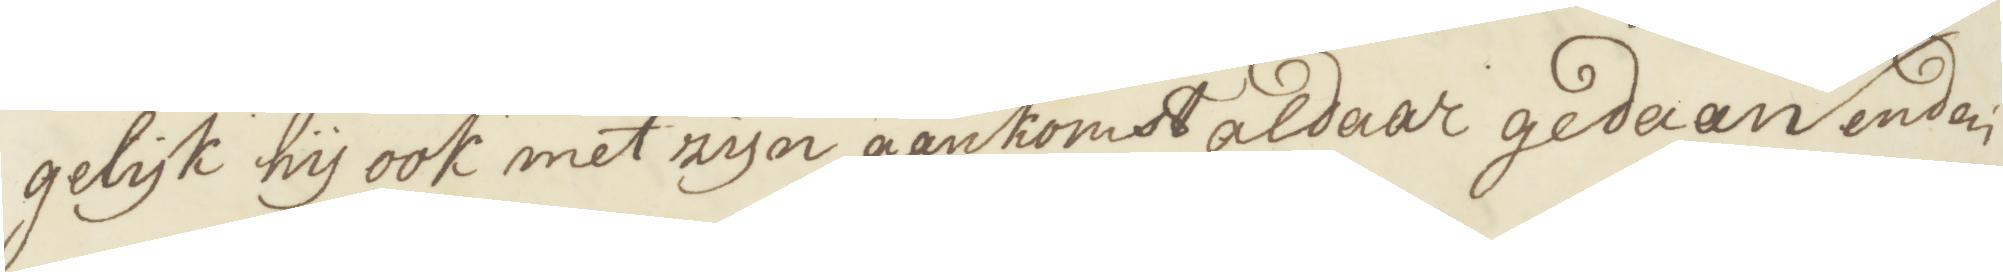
gelijk hij ook met zijn aankomst aldaar gedaan en den
